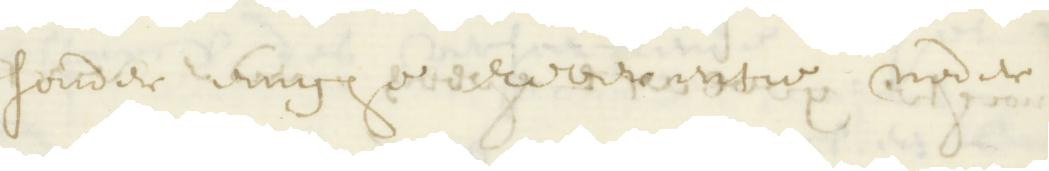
sonder einghe heverentie neder
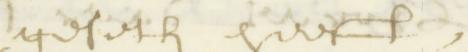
geseth heest.
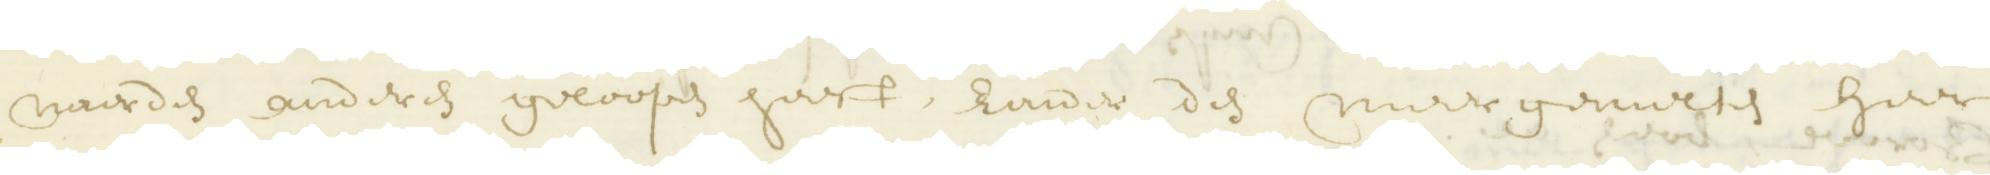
naerden anderen geloopen heeft, hinder den meer gemelsch Heer
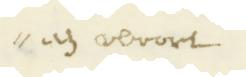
„een woort
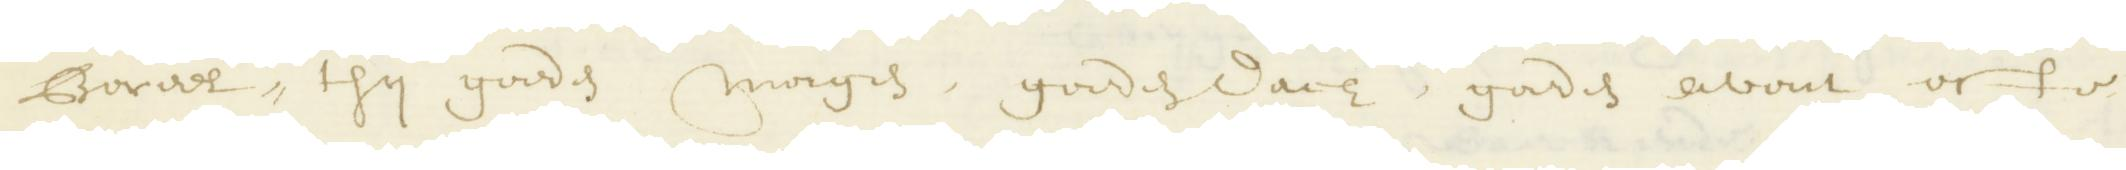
Bereel „ thij goeden mogen, goeden dach gaden avont oste
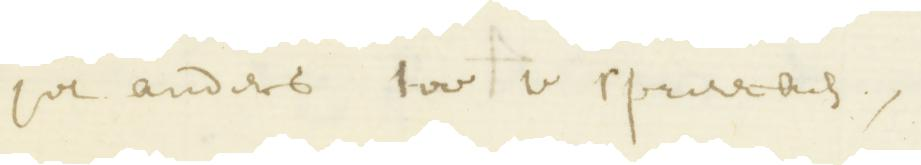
jel anders toe te spreecken.
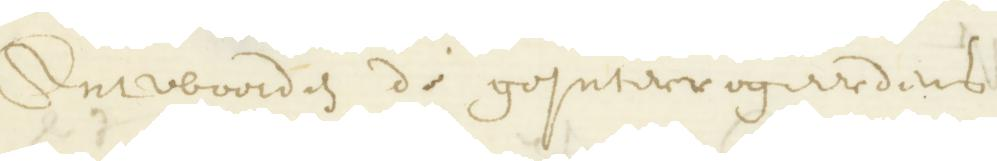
Intwoorden d' ge Intervegeerdens
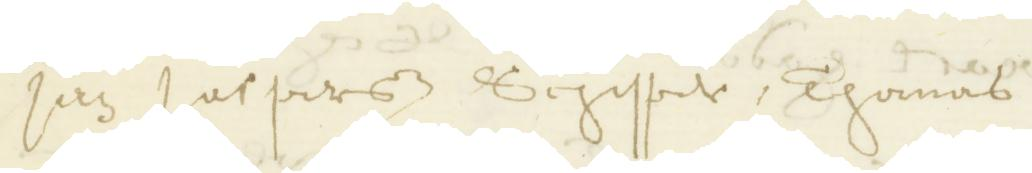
jaen jespers Schipper Ehmas
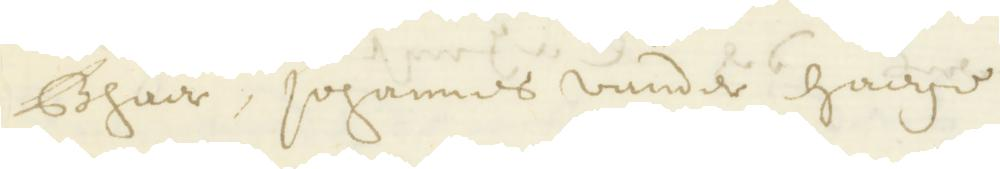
Bhaer, johannes vander haeije
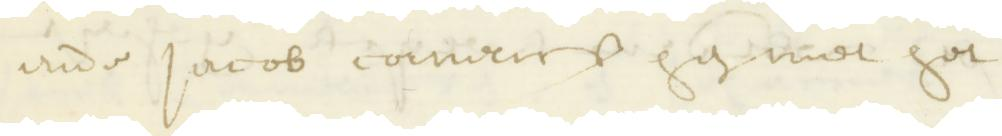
ende Jacob corneniss hes met het
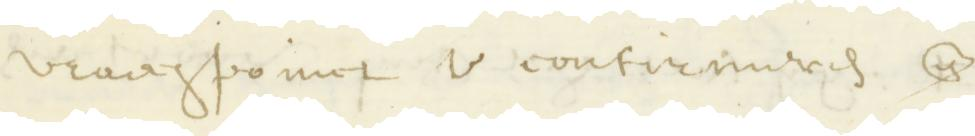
vraech poinct te confirmeren ende
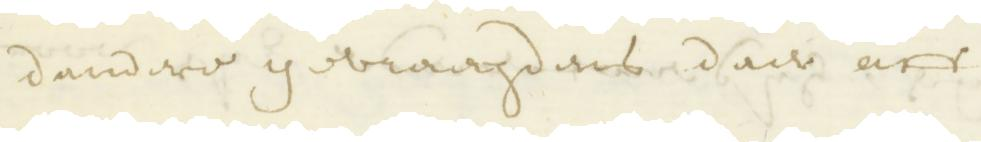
dandere gevreechdens daer aft
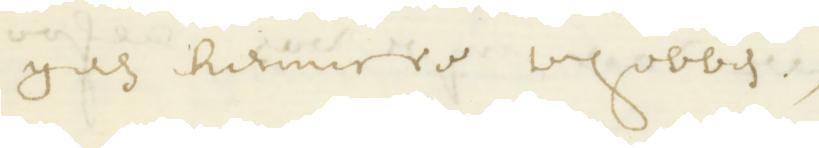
geen henniste te hebben.
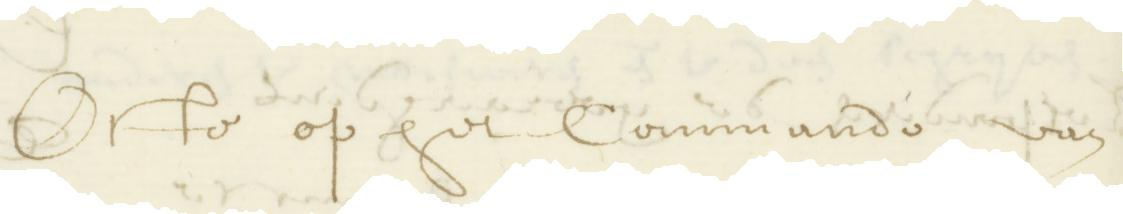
Oste op het Commands van
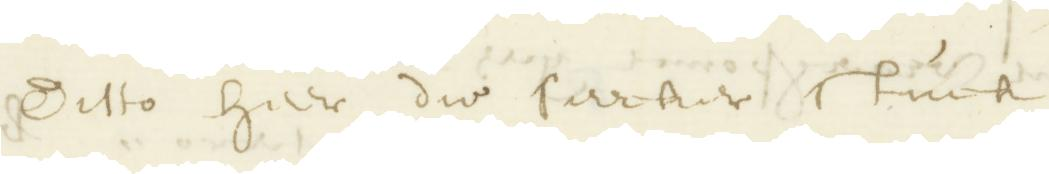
Ditto heer die seecker stuck
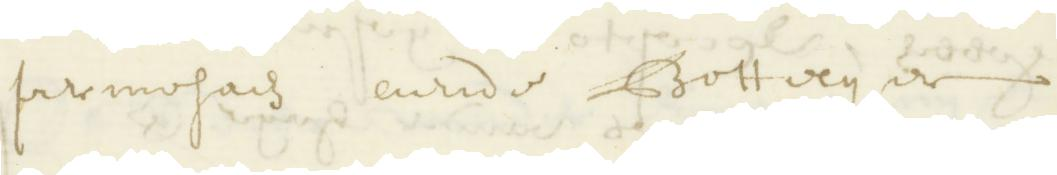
permesaen aende Bottelijer
